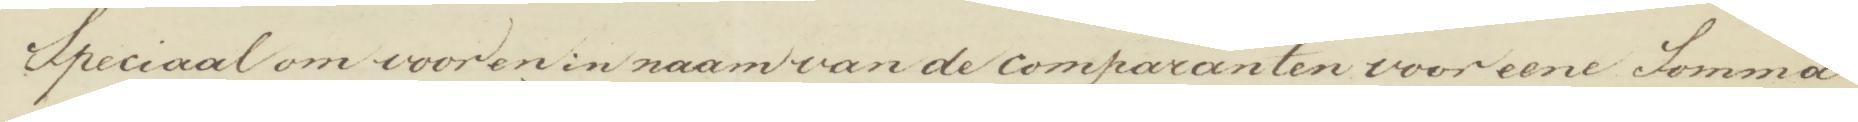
Speciaal om voor en in naam van de comparanten voor eene Somma
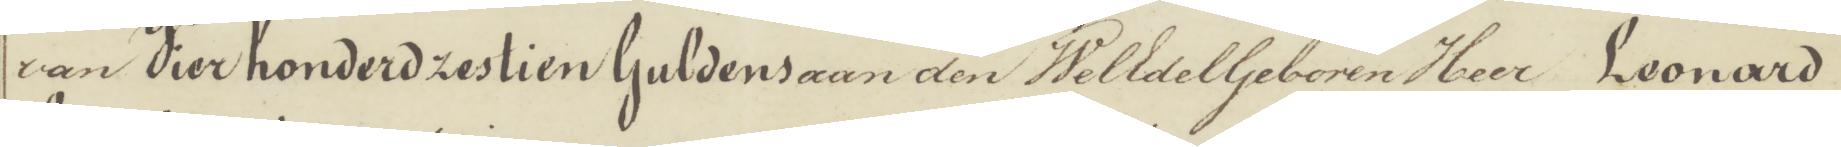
van Vier honderd zestien Guldens aan den WelEdelGeboren Heer Leonard
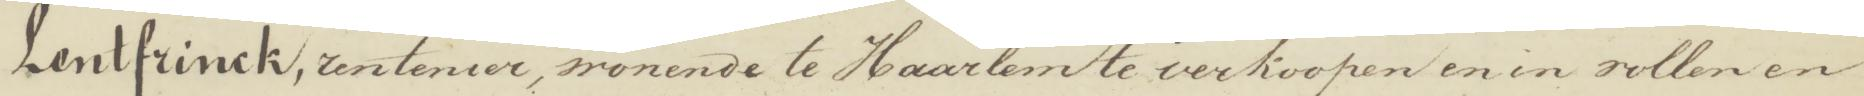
Lentfrinck, rentenier, wonende te Haarlem te verkoopen en in vollen en
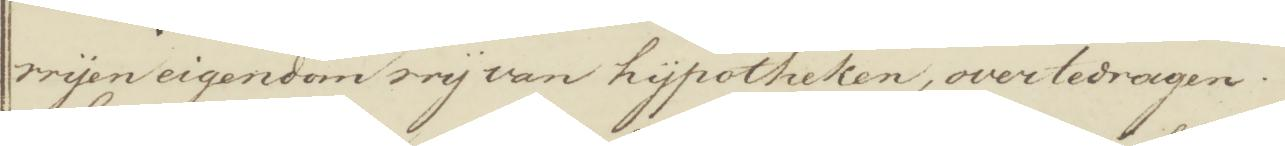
vrijen eigendom vrij van hijpotheken, over te dragen.
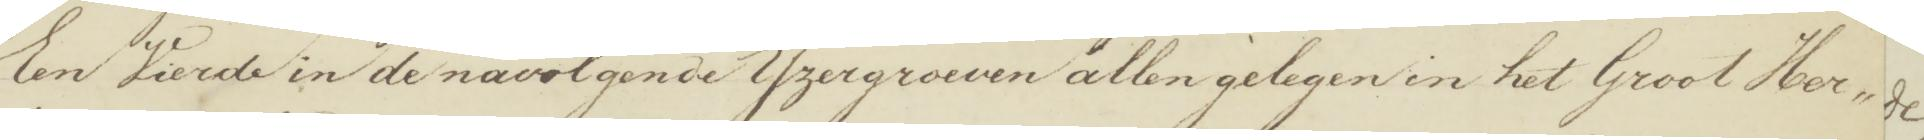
Een Vierde in de navolgende IJzergroeven allen gelegen in het Groot Her„
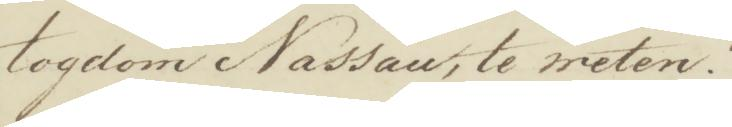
togdom Nassau, te weten.
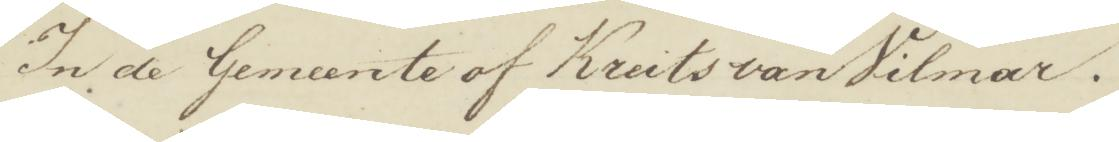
In de Gemeente of Kreits van Vilmar.
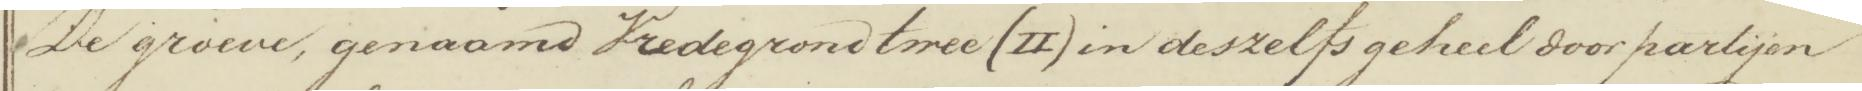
De groeve, genaamd Vredegrond twee (II) in deszelfs geheel door partijen
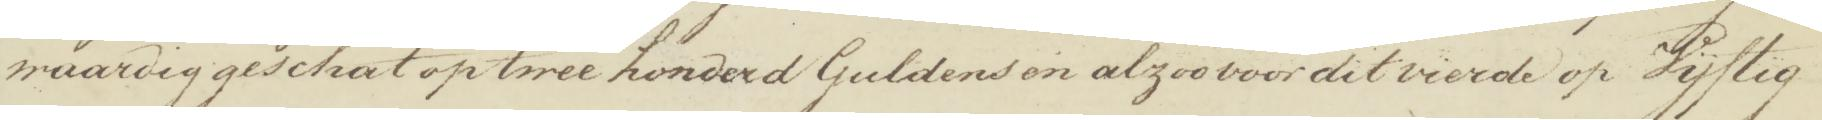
waardig geschat op twee honderd Guldens en alzoo voor dit vierde op Vijftig
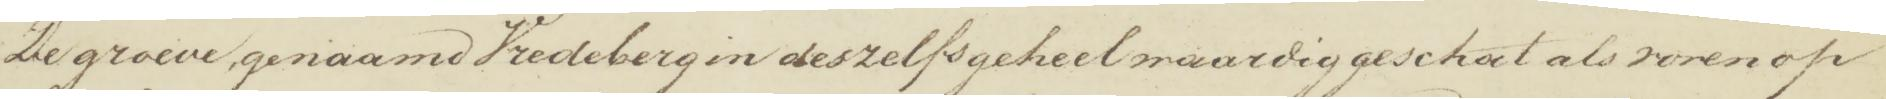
De groeve, genaamd Vredeberg in deszelfs geheel waardig geschat als voren op
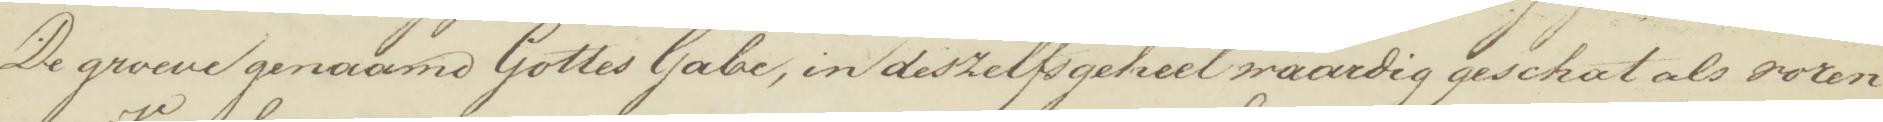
De groeve genaamd Gottes Gabe, in deszelfs geheel waardig geschat als voren
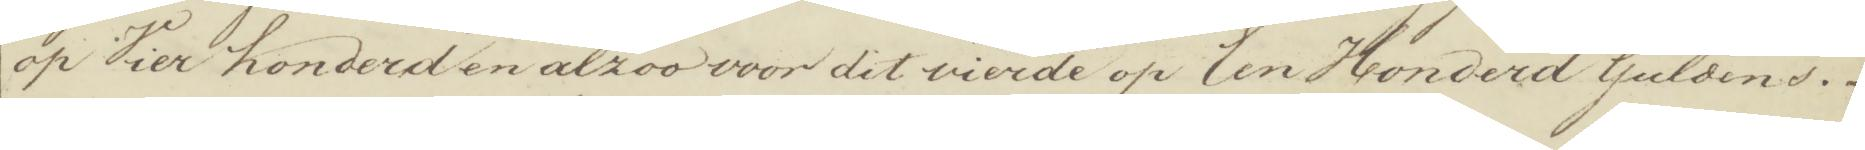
op Vier honderd en alzoo voor dit vierde op Een Honderd Guldens.-
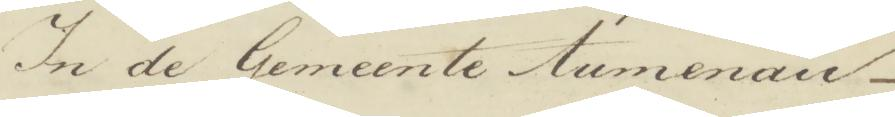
In de Gemeente Aumenau
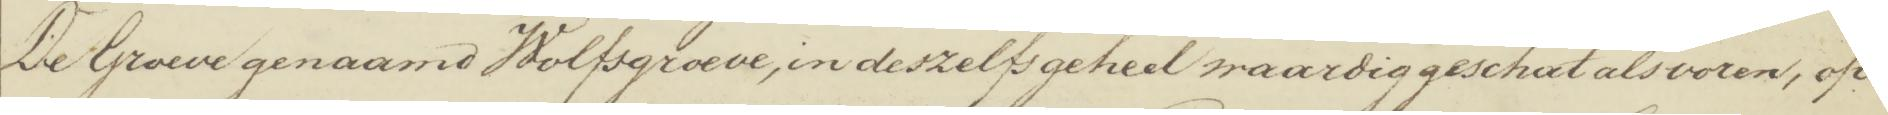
De Groeve genaamd Wolfsgroeve, in deszelfs geheel waardig geschat als voren, op
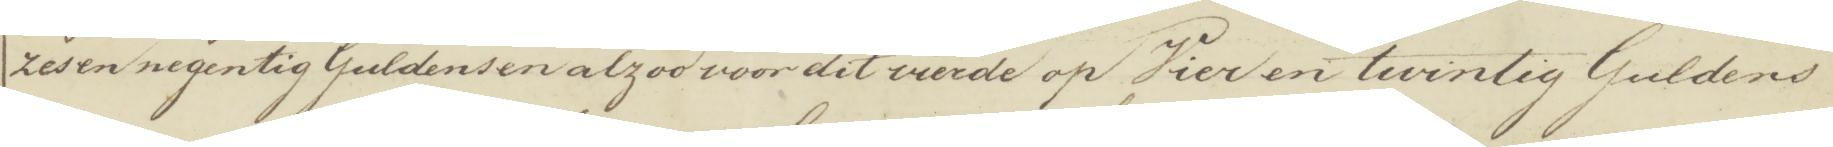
zes en negentig Guldens en alzoo voor dit vierde op Vier en twintig Guldens
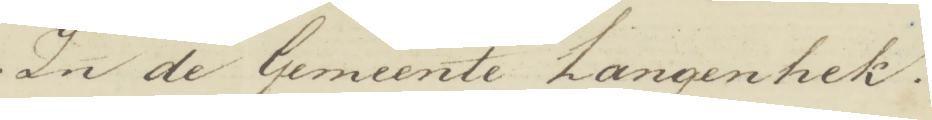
In de Gemeente Langenhek.
